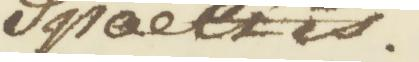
Spoelt is.
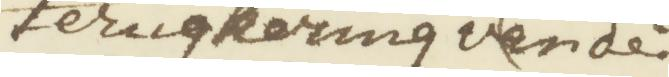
terug kering van de
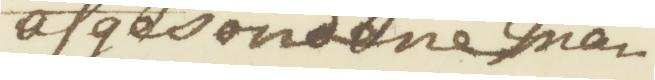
afgesondene man
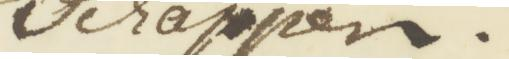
Schappen.
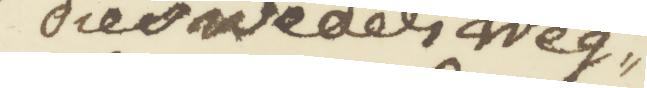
dies weder weg„
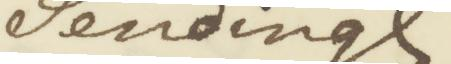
Sendingh
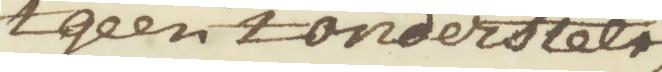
t geen 't onderstelt
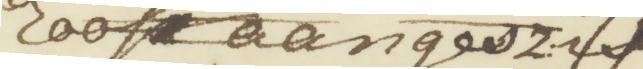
hooft aan gesz: is
